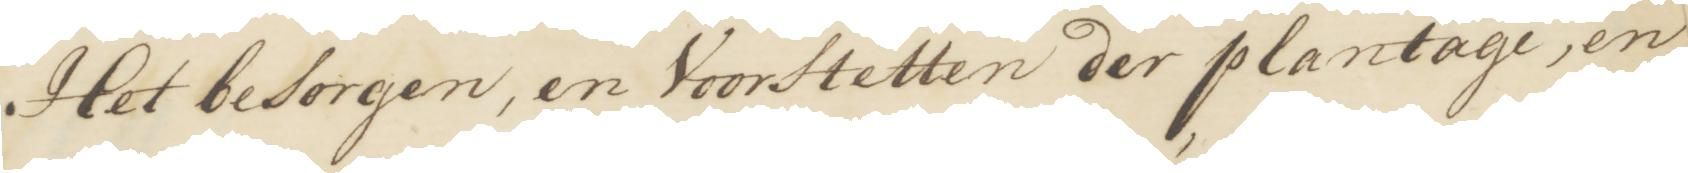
Het besorgen, en voorstetten der plantage, en
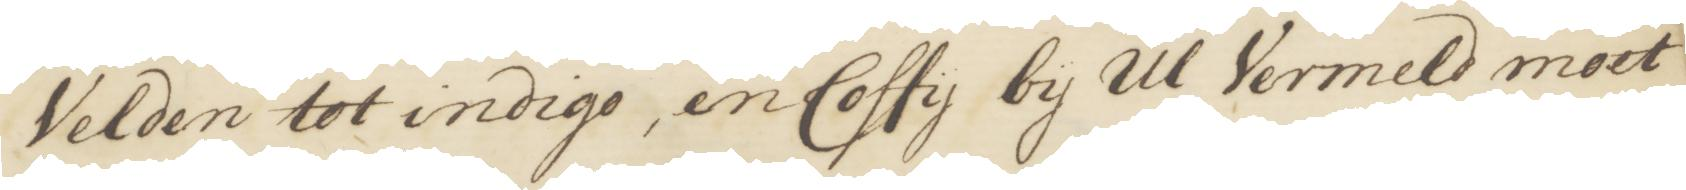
Velden tot indigo, en coffij bij UE Vermeld moet
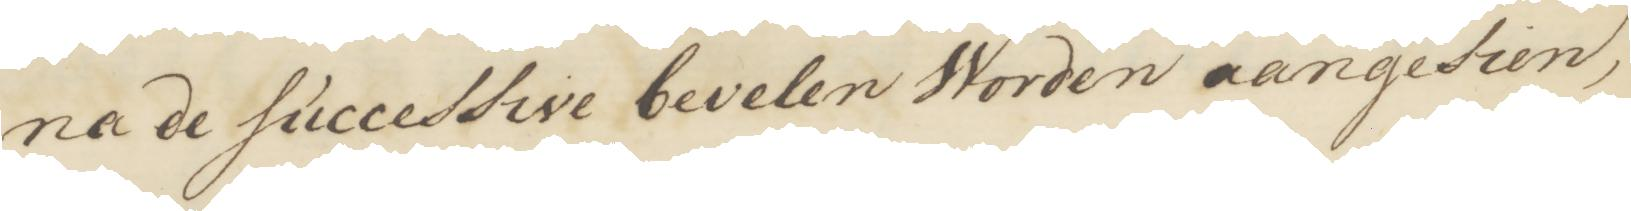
na de successive bevelen Worden aangesien,
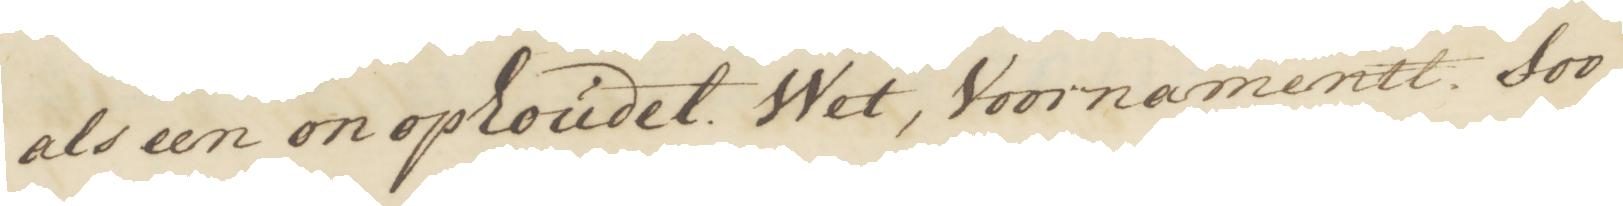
als een on ophoudel. Wet, voornamentt. soo
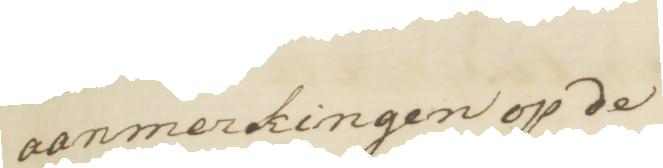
aanmerkingen op de
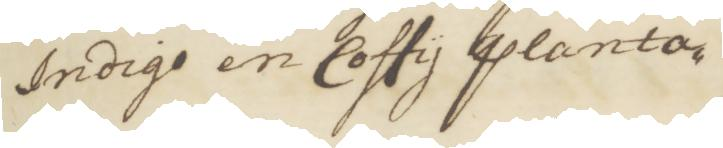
endigt en coffij planta„
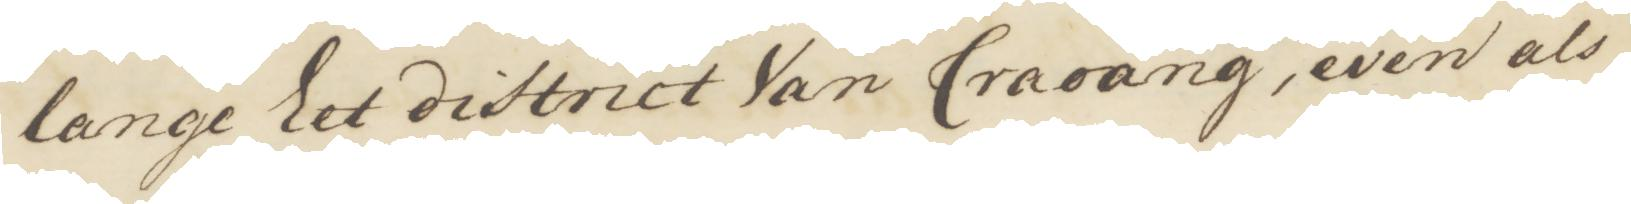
lange het district van Craoang, even als
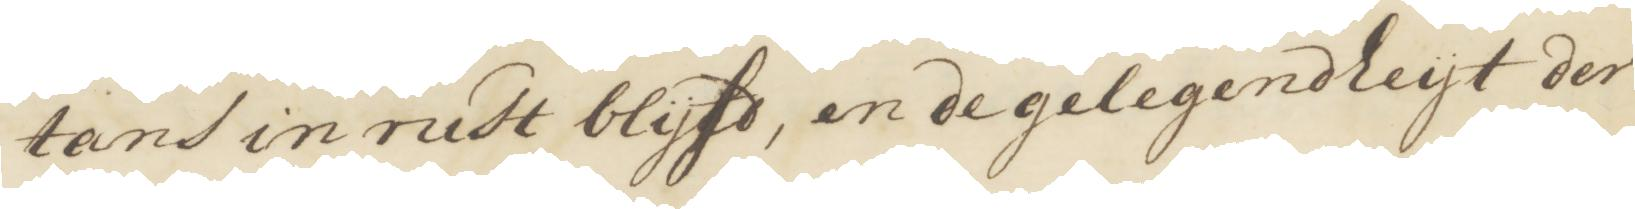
tans in rust blijfd, en de gelegendheijt der
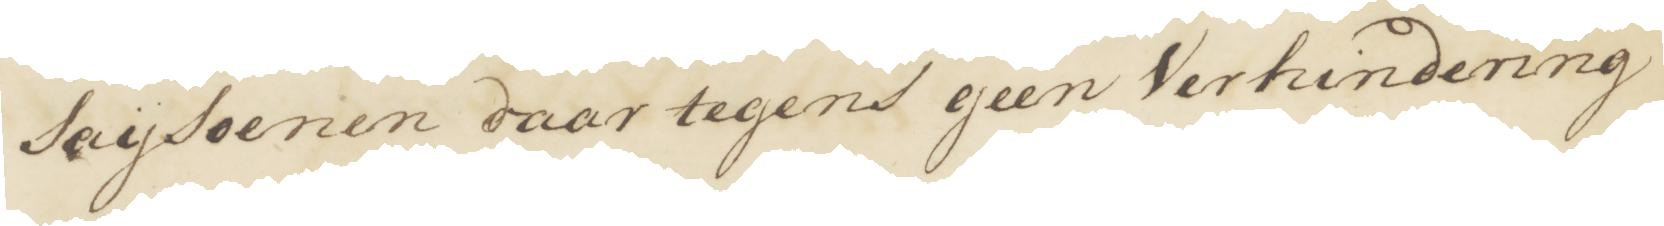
saijsoenen daar tegens geen Verhindering
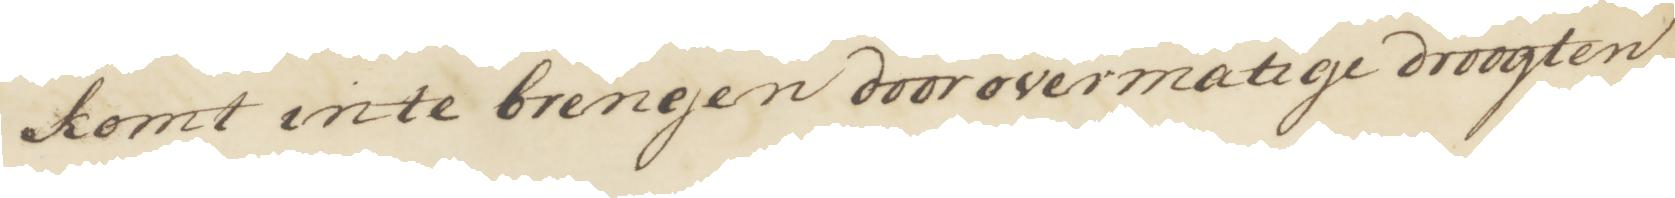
komt in te brengen door overmatige droogten,
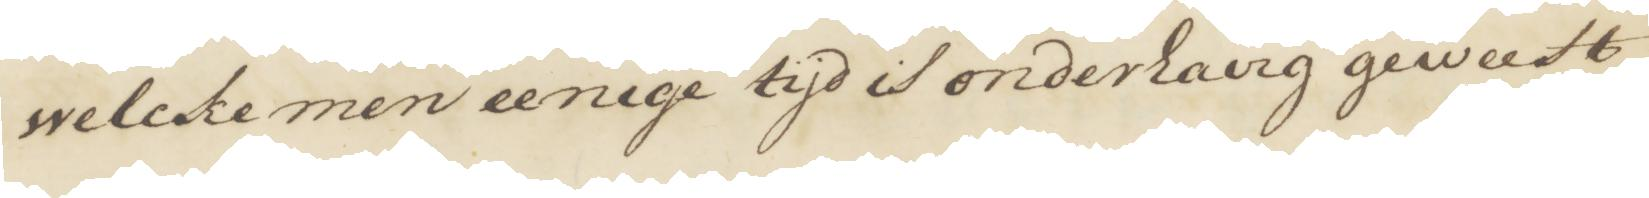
welcke men eenige tijd is onderhavig geweest,
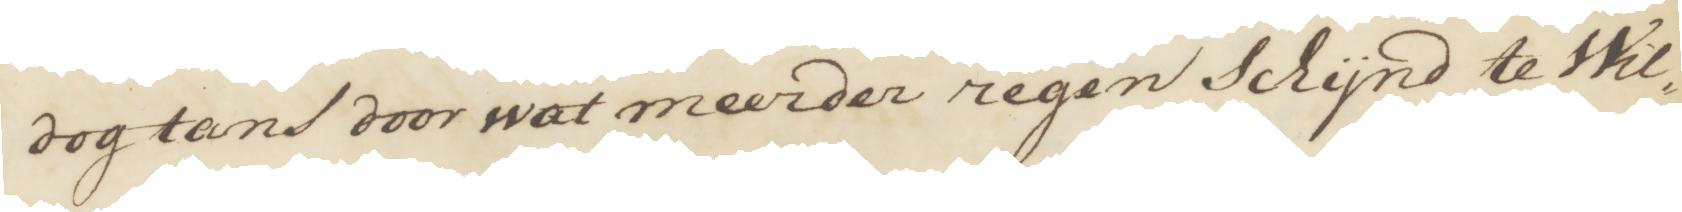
dog tans door wat meerder regen schijnd te Wi„
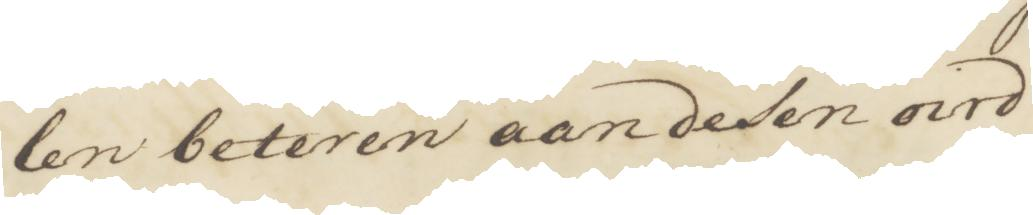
len beteren aan desen oird
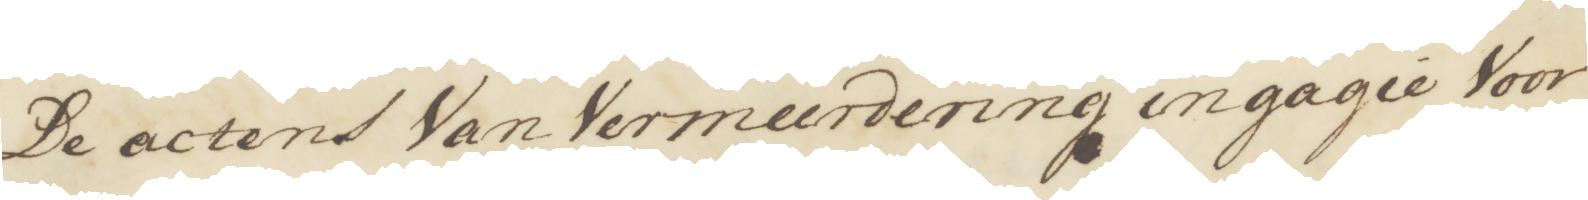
De actens Van Vermeerdering ingagie Voor
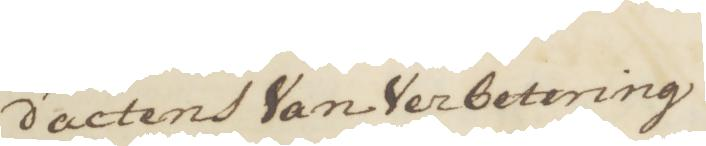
d'actens Van Verbetering
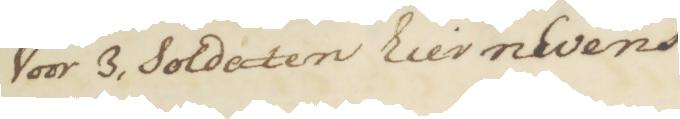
Voor 3, soldaten hier nevens
